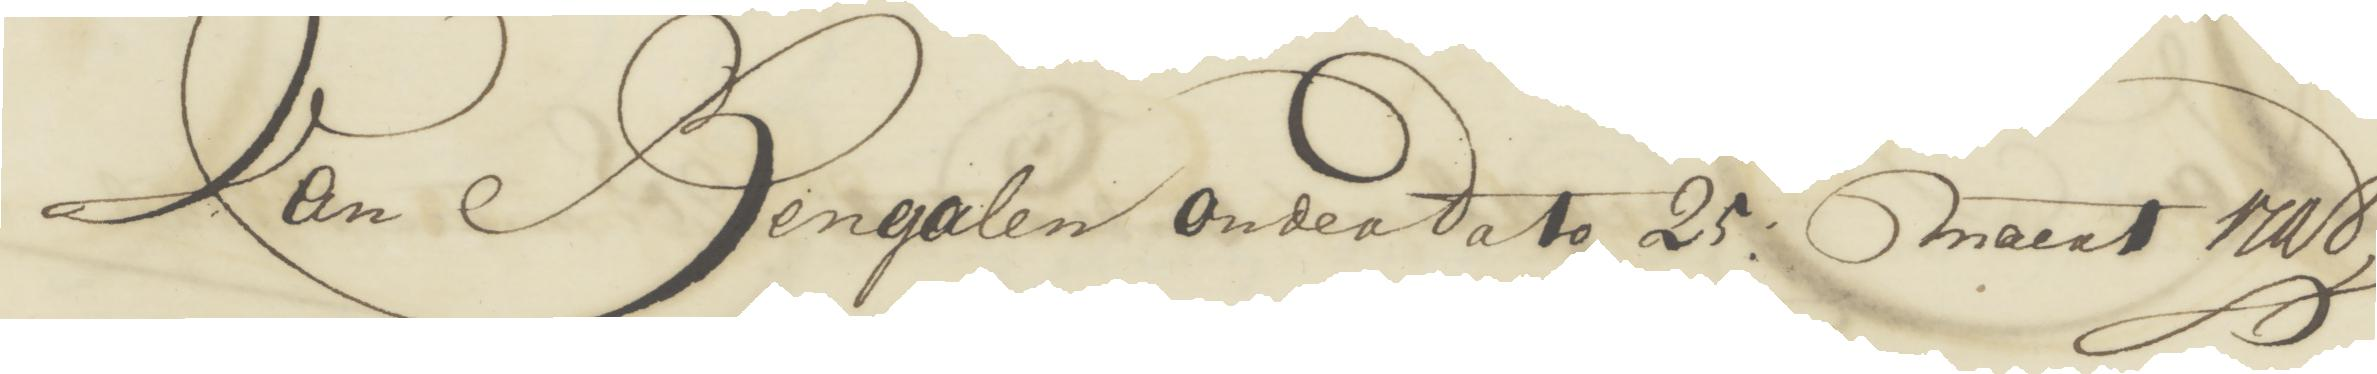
Van Bengalen onder dato 25:' Maert 1748
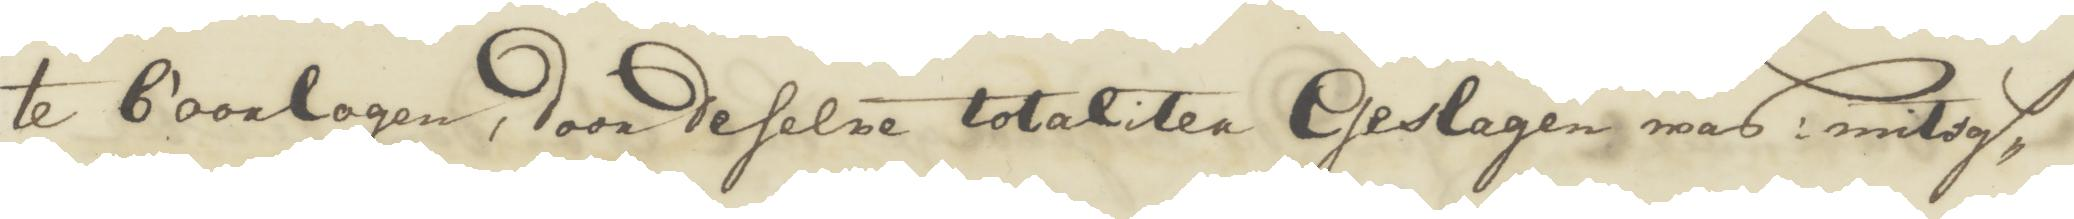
te b'oorlagen, door deselve totaliter Geslagen was mitsg„s
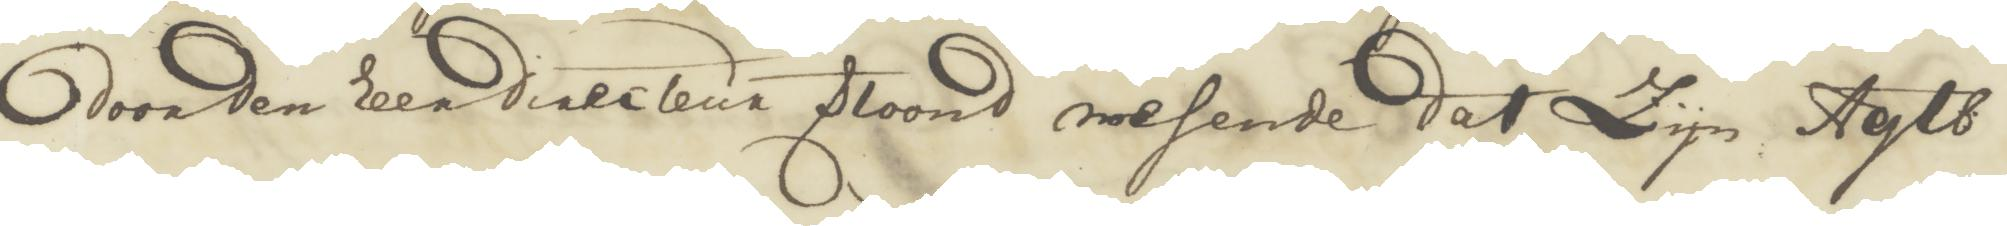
door den heer directeur vertoond wesende dat zijn Agtb
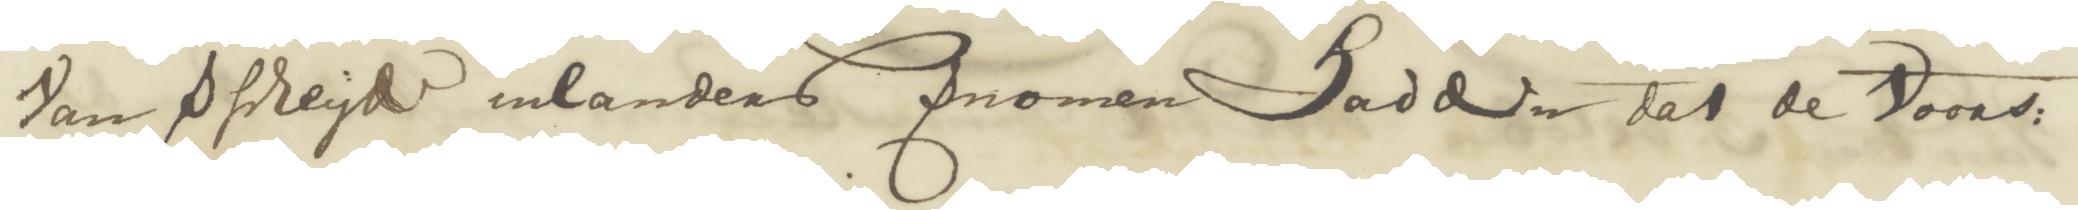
van verscheijde inlanders vernomen hadden dat de voors:
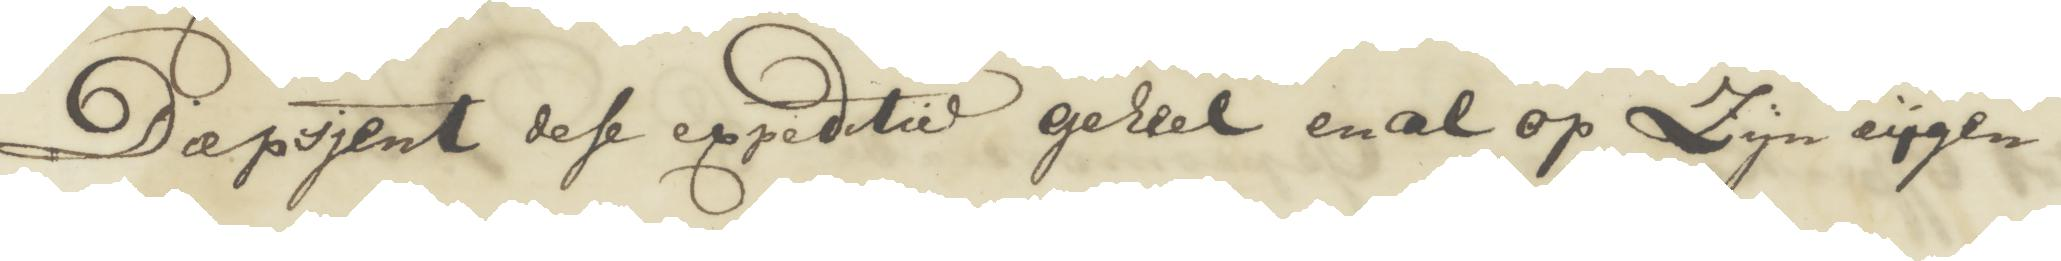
Dapsjent dese expeditie geheel en al op zijn eijgen
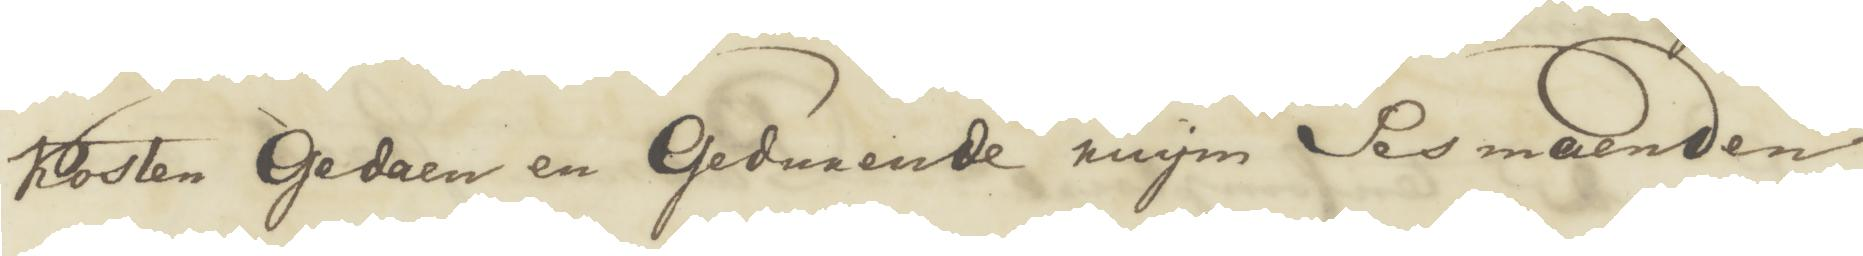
kosten Gedaen en Gedurende ruijm ses maenden
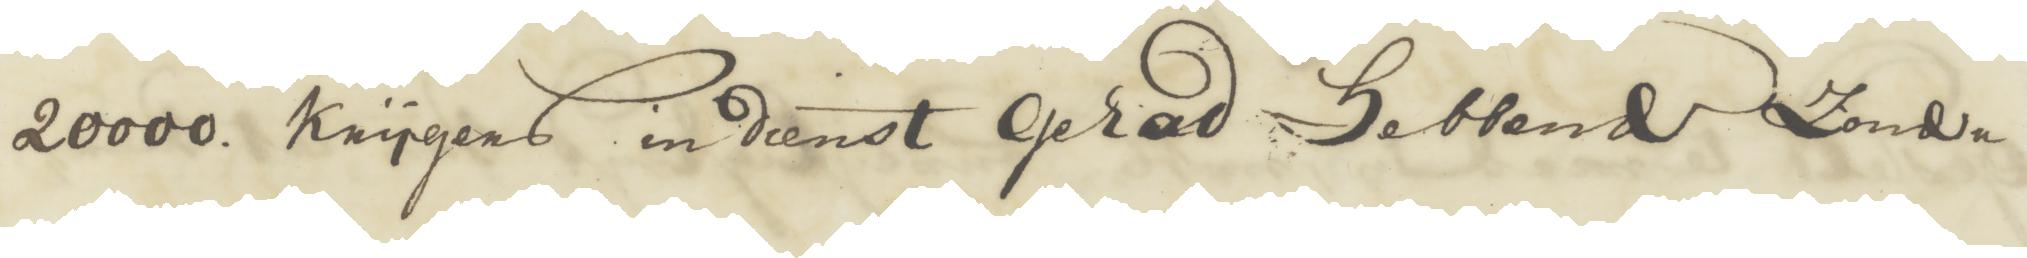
20000. krijgers in dienst gehad hebbende zonder
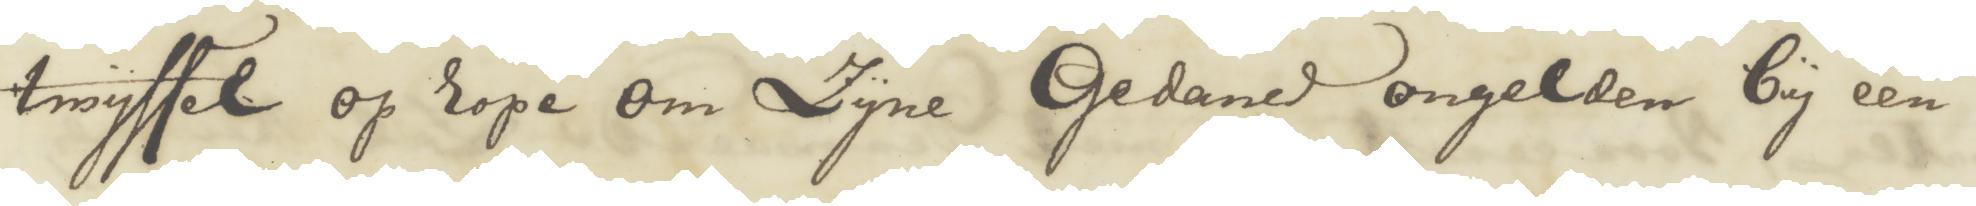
twijffel op hope om zijne Gedane ongelden bij een
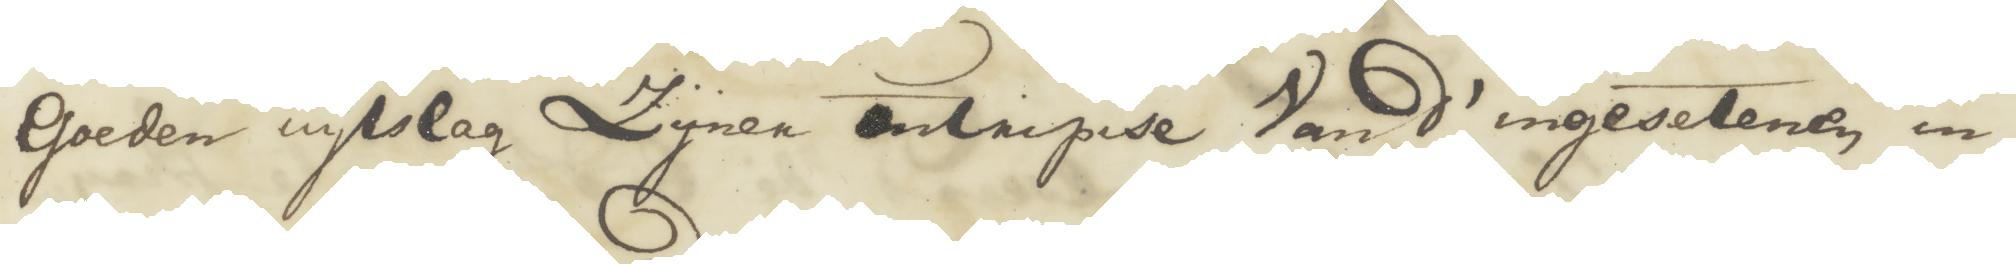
Goeden uijtslag zijner outripise van d’ingesetenen in
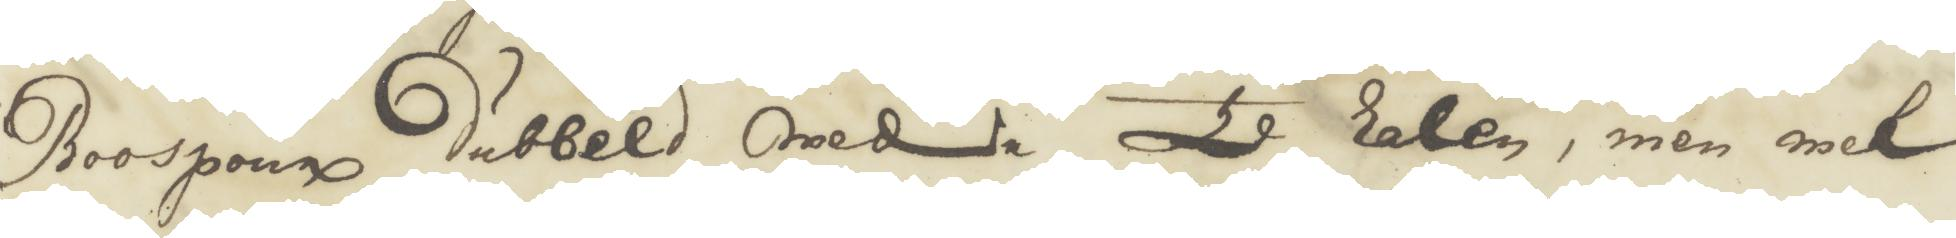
Boospour dubbeld mede te halen, men wel
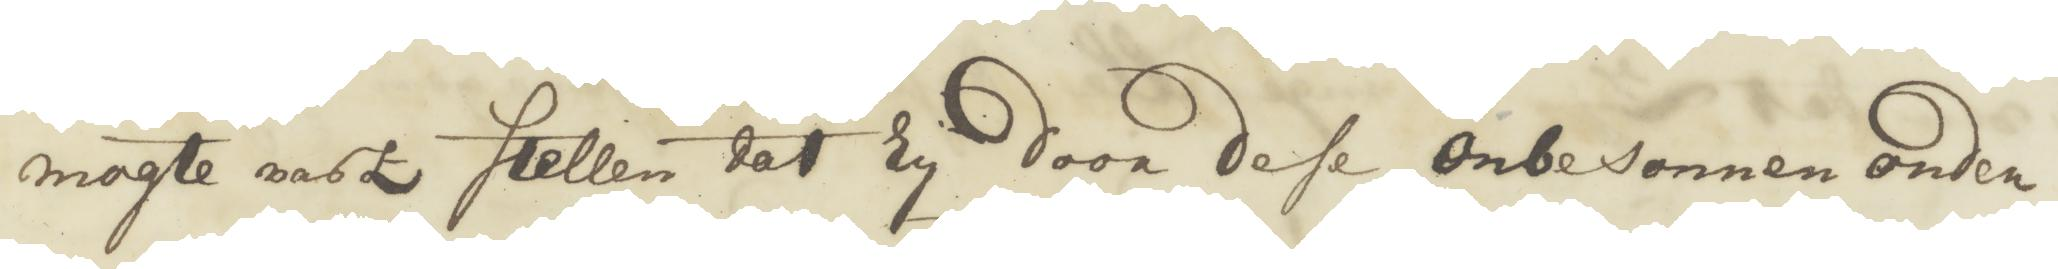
mogte vast stellen dat hij door dese onbesonnen onder
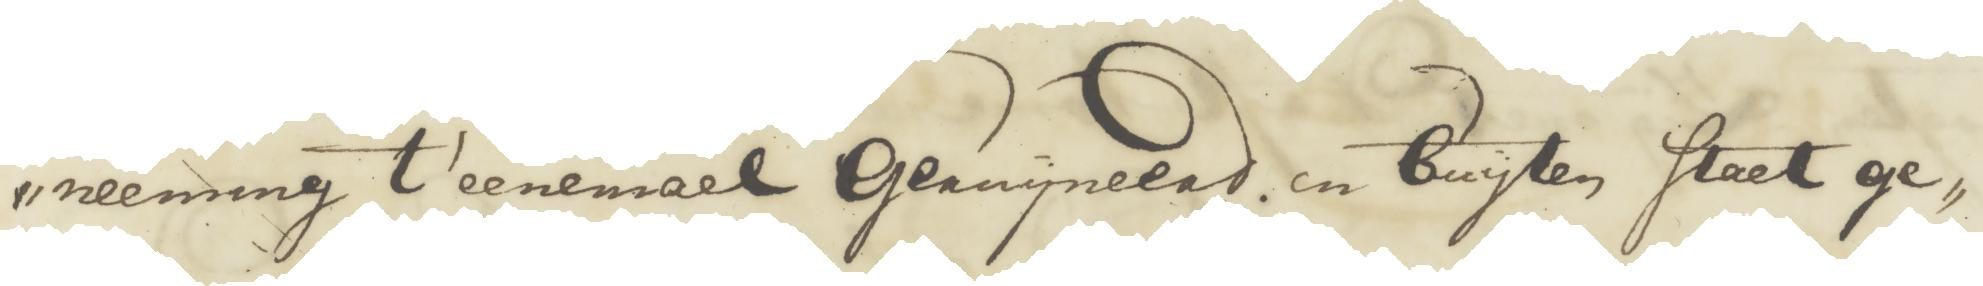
„neeming t'eenemael geruijneerd en buijten staet ge„
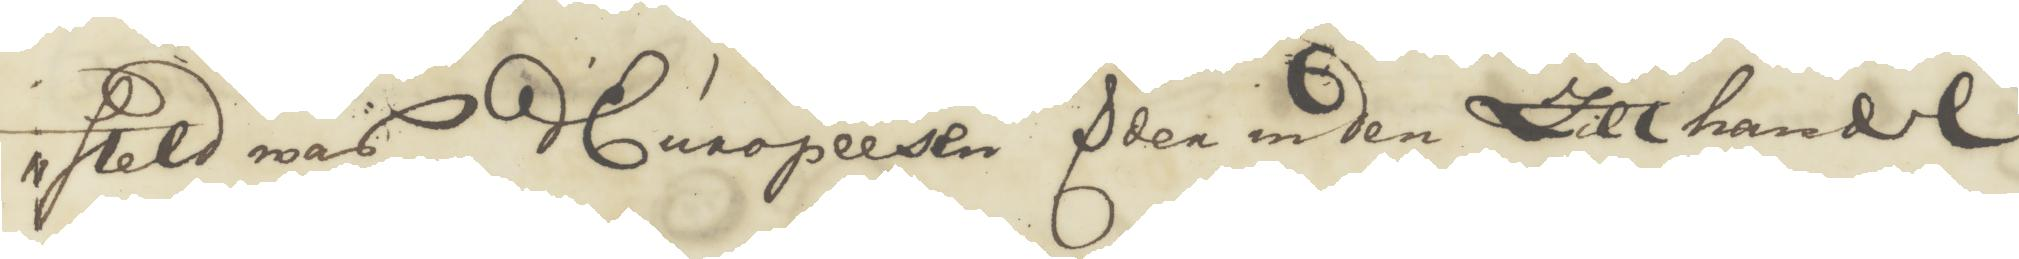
„steld was d'Europeesen verder in den zilt handel
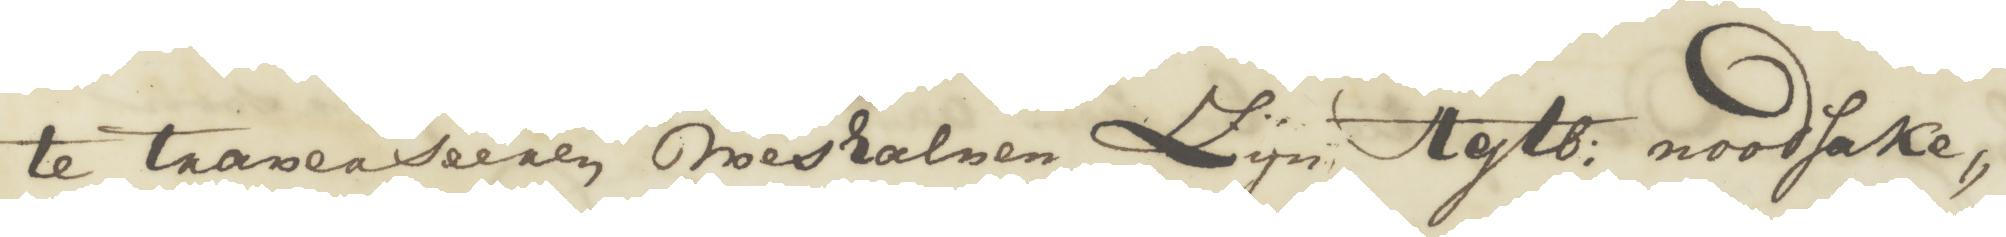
te traverseeren weshalven zijn Agtb: noodsake„
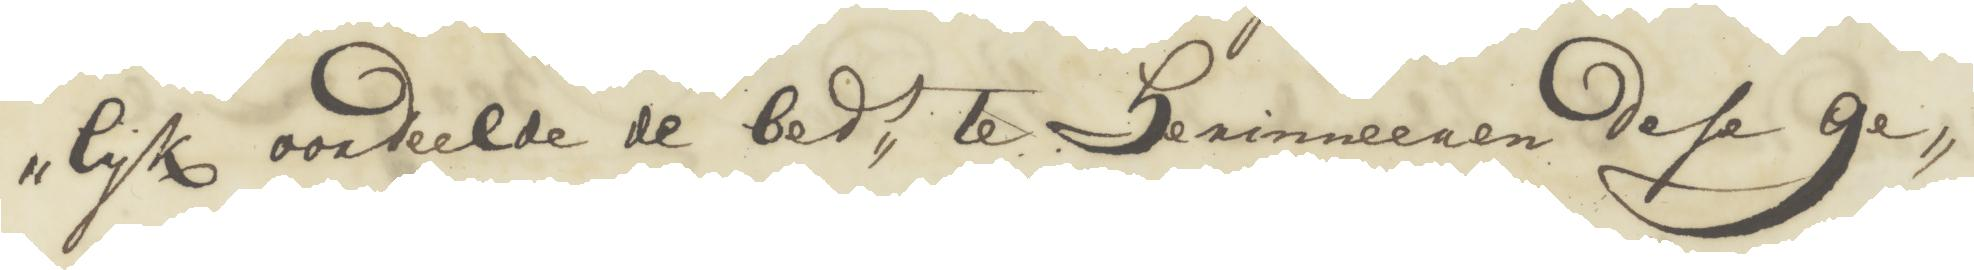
„lijk oordeelde de bed„s te Herinneeren dese ge„
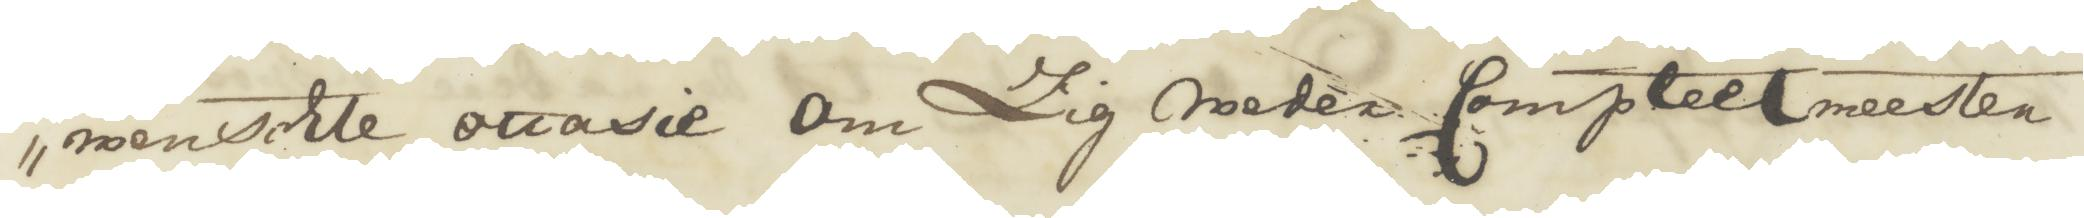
„wenschte occasie om zig weder Compleet meester
